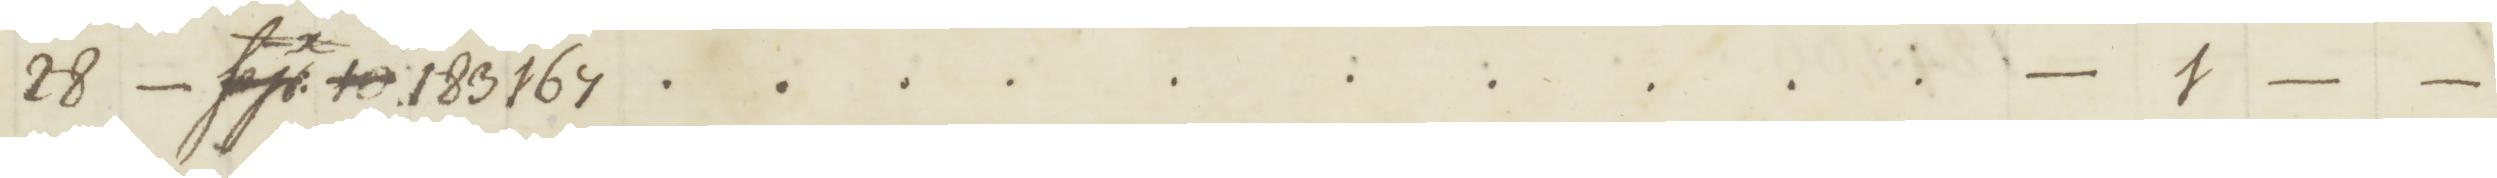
28 — sept 10 183 167 . . . . . . . . . . . . . — 1 — —
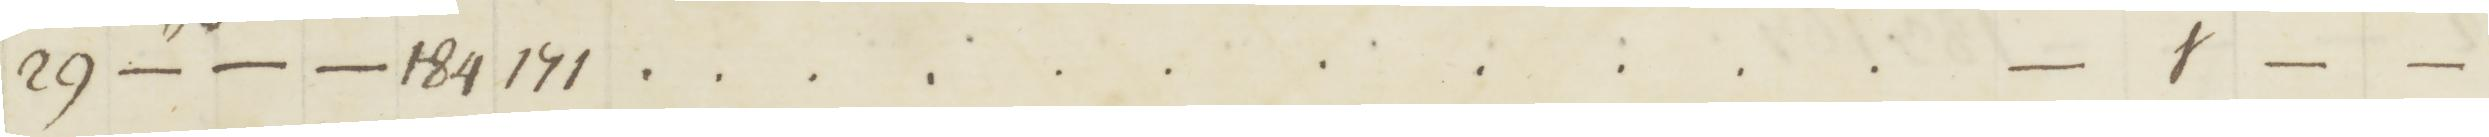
29 — — — 184 171 . . . . . . . . . . . . . — 1 — —
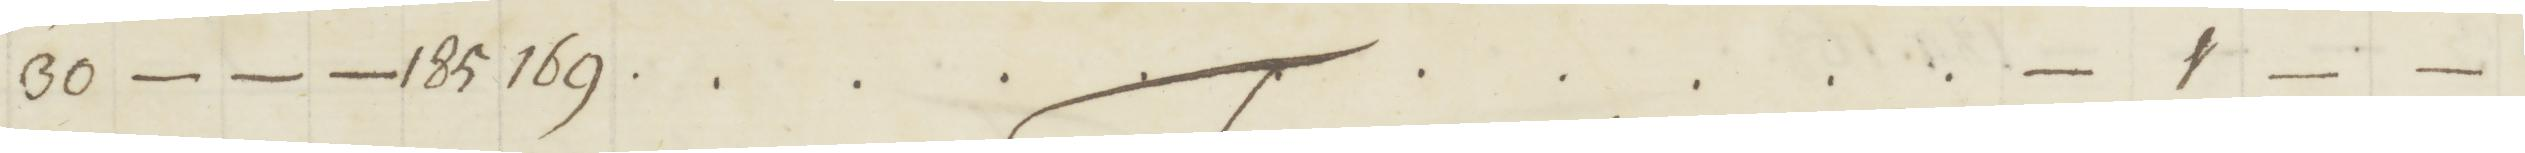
30 — — — 185 169 . . . . . . . . . . . . — 1 — —
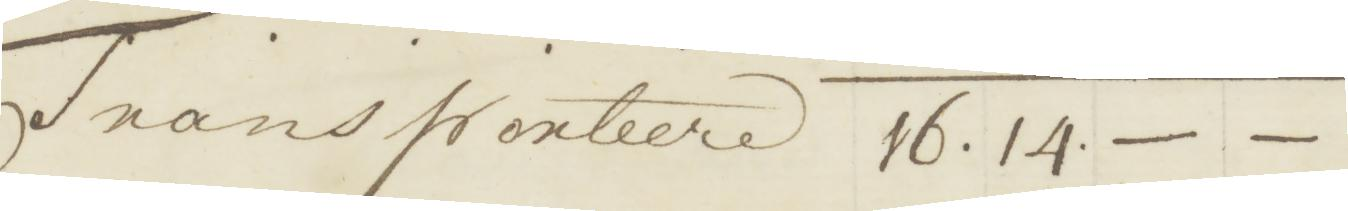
Transportere 16.14.— —
